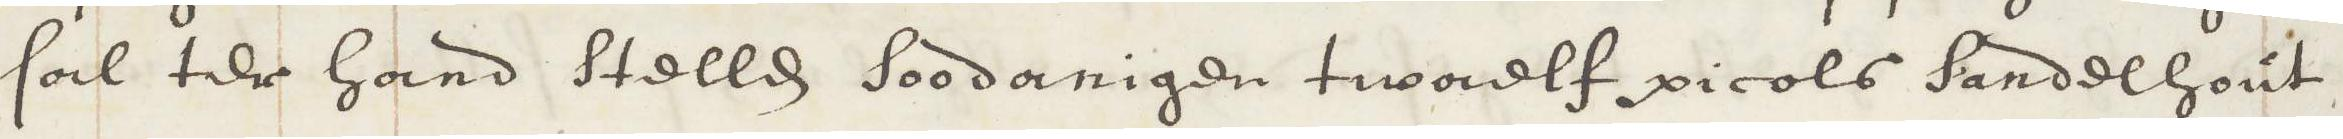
sal ter hand stellen soodanigen twaelf picols s'andelhout
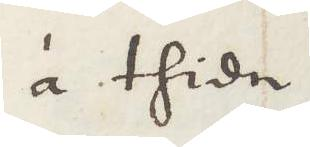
à thien
